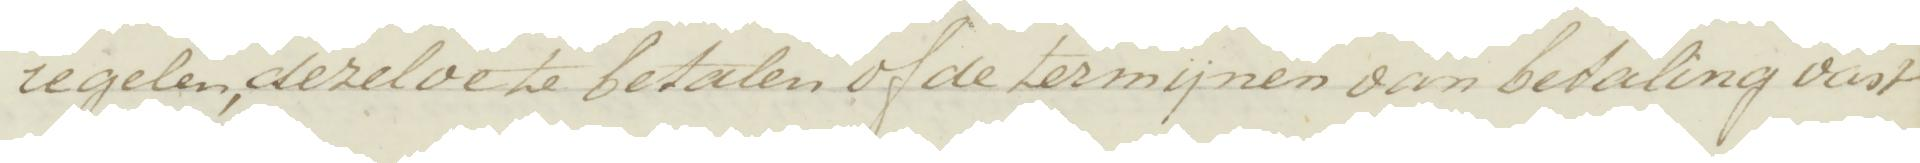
regelen, dezelve te betalen of de termijnen van betaling vast
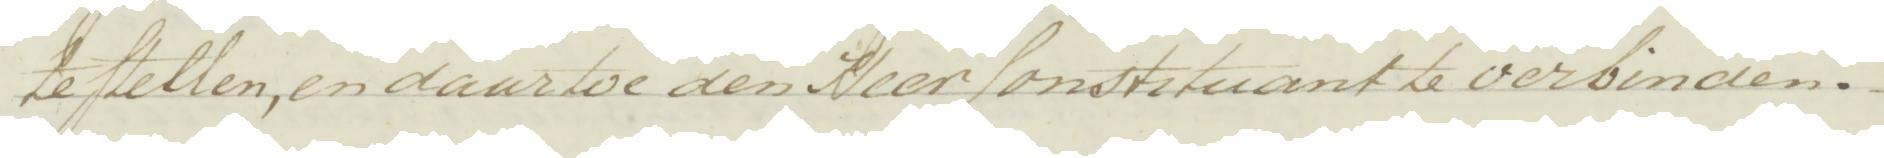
te stellen, en daartoe den Heer Constituant te verbinden.
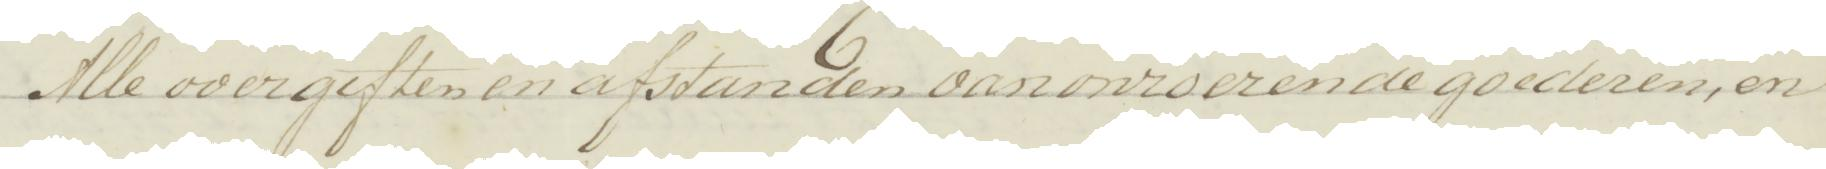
Alle overgiften en afstanden van onroerende goederen, en
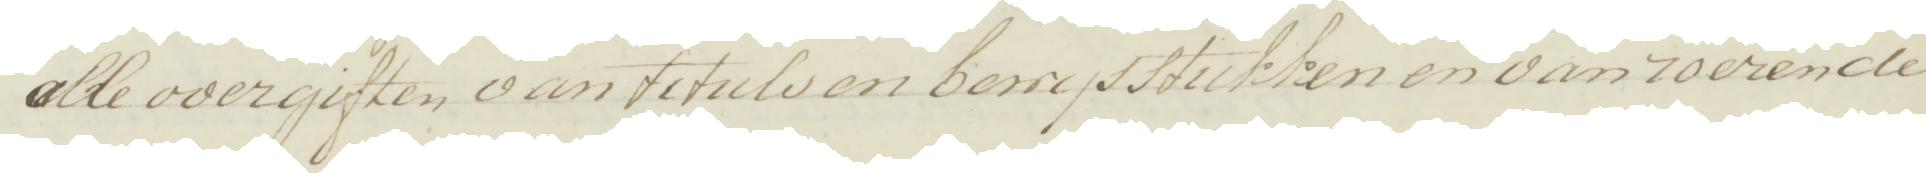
alle overgiften van tituls en bewysstukken en van roerende
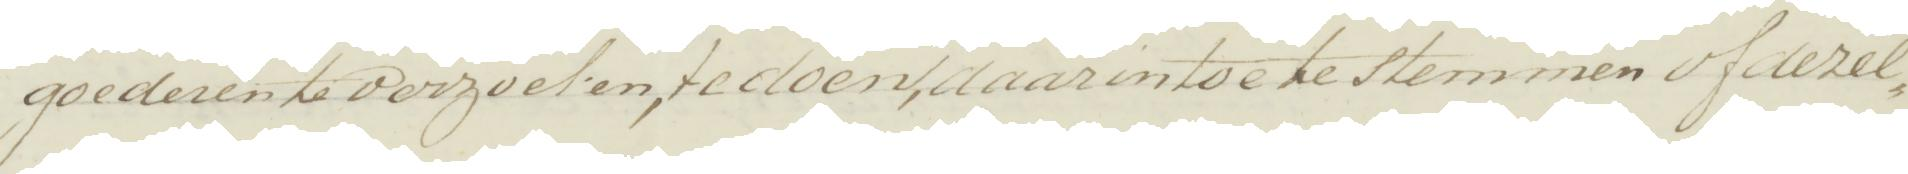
goederen te verzoeken, te doen, daar in toe te stemmen of dezel
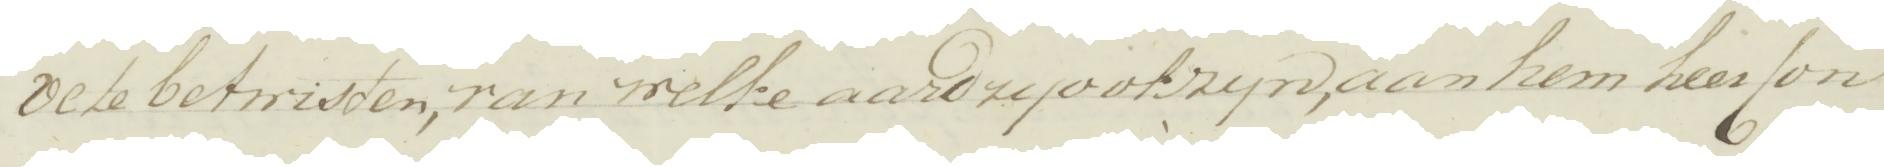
ve te betwisten, van welke aard zy ook zyn, aan hem heer Con
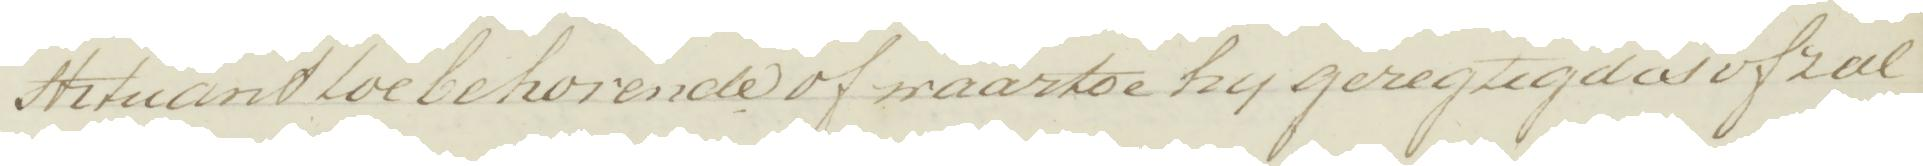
stituant toebehorende of waartoe hy geregtigd is of zal
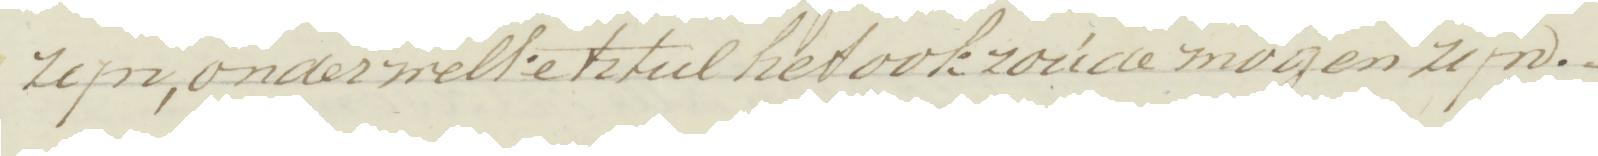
zyn, onder welke titul het ook zoude mogen zyn.
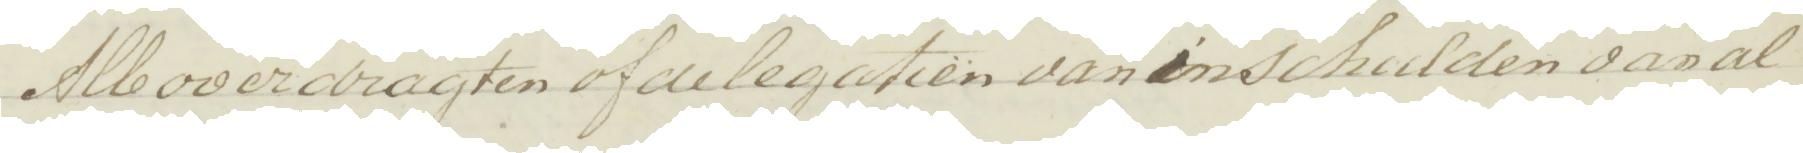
Alle overdragten of delegatien van inschulden van al
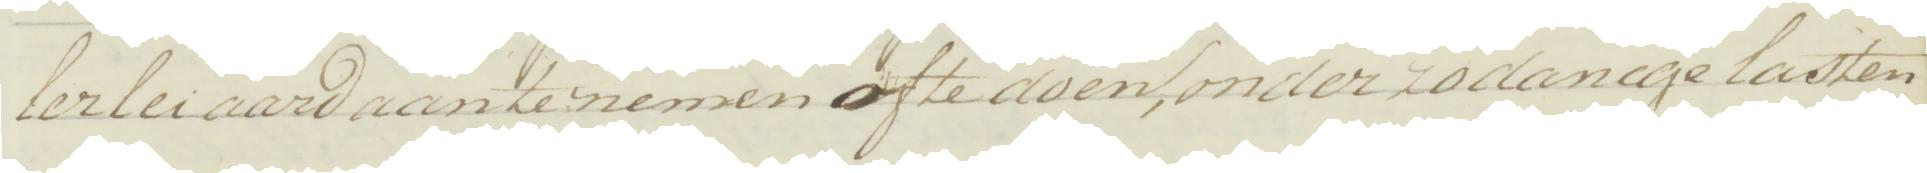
lerlei aard aan te nemen of te doen, onder zodanige lasten
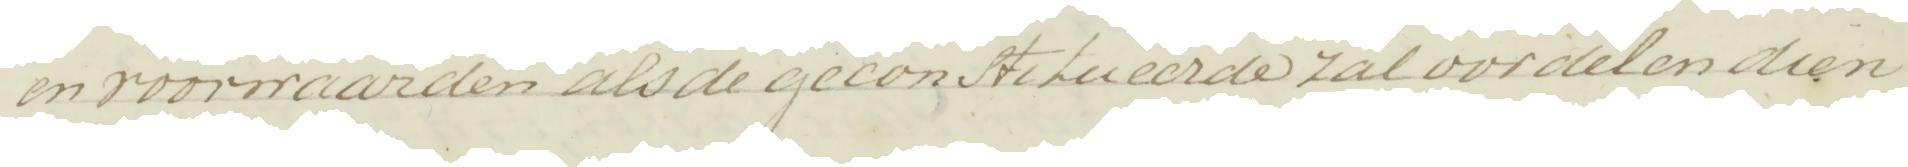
en voorwaarden als de geconstitueerde zal oordelen dien
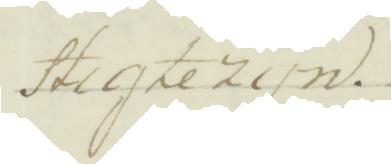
stig te zyn.
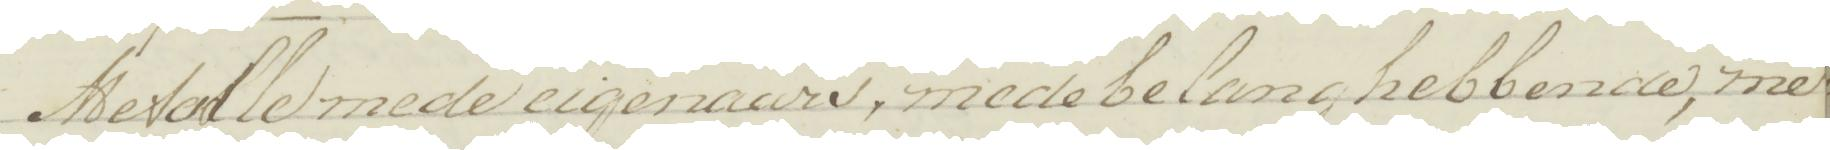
Met alle mede eigenaars, mede belanghebbende, me
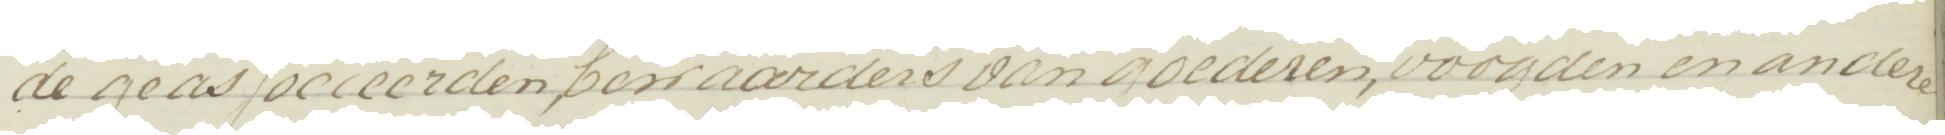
de geassocieerden, bewaarders van goederen, voogden en andere
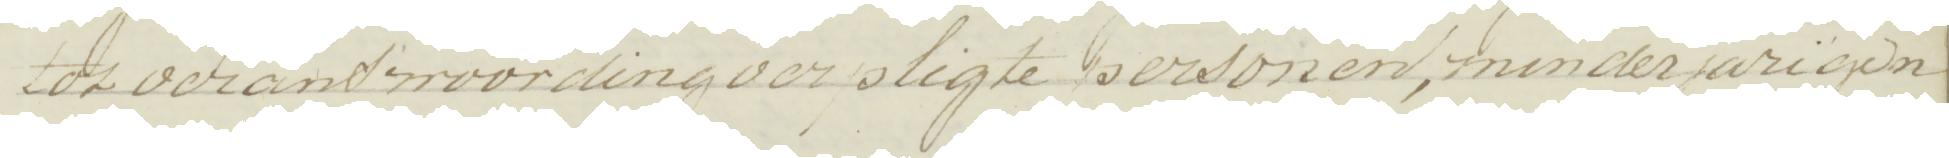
tot verantwoording verpligte personen, minderjarigen
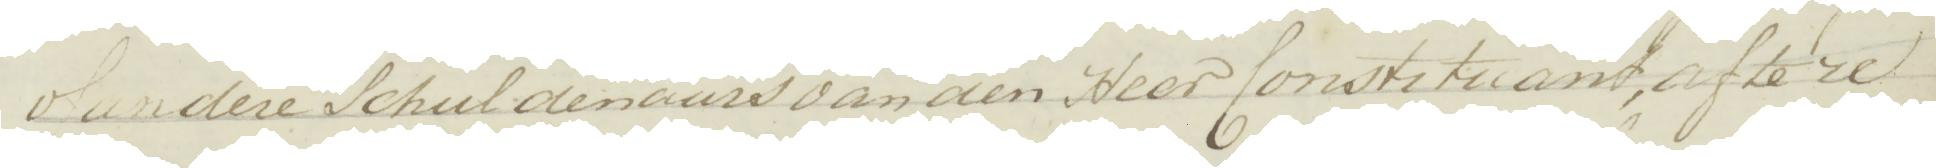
of andere schuldenaars aan den Heer Constituant, af te re
